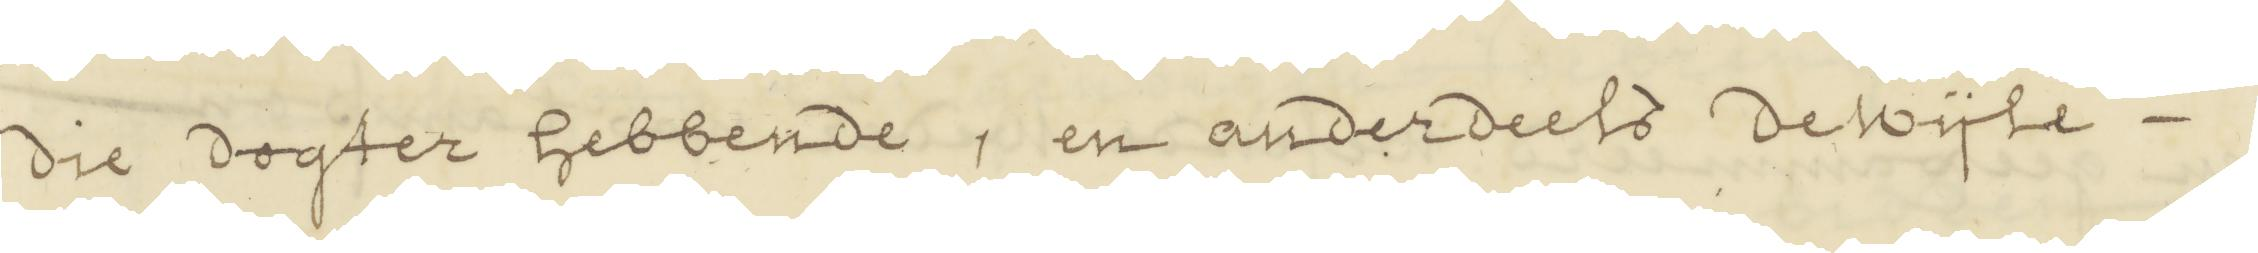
die dogter hebbende, en anderdeels dewijle —
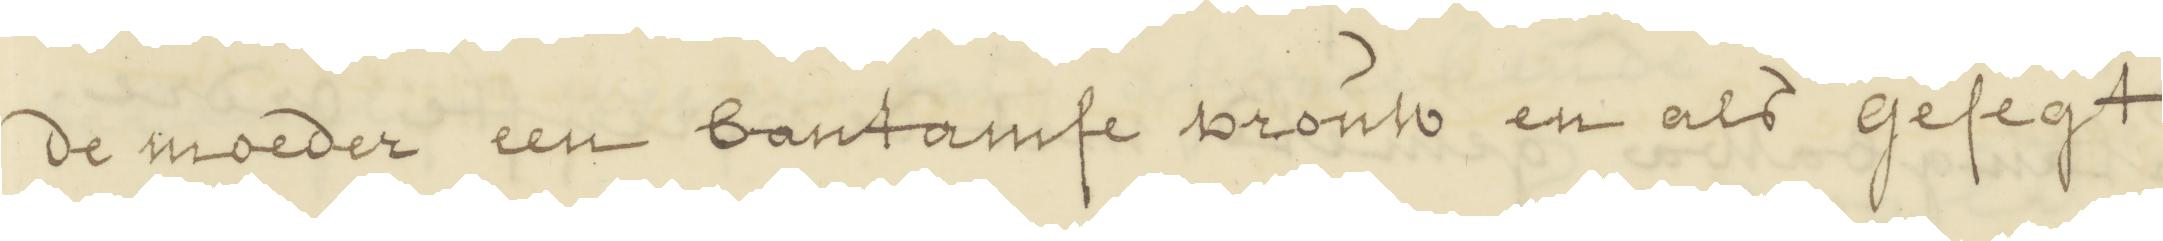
de moeder een bantamse vrouw en als gesegt
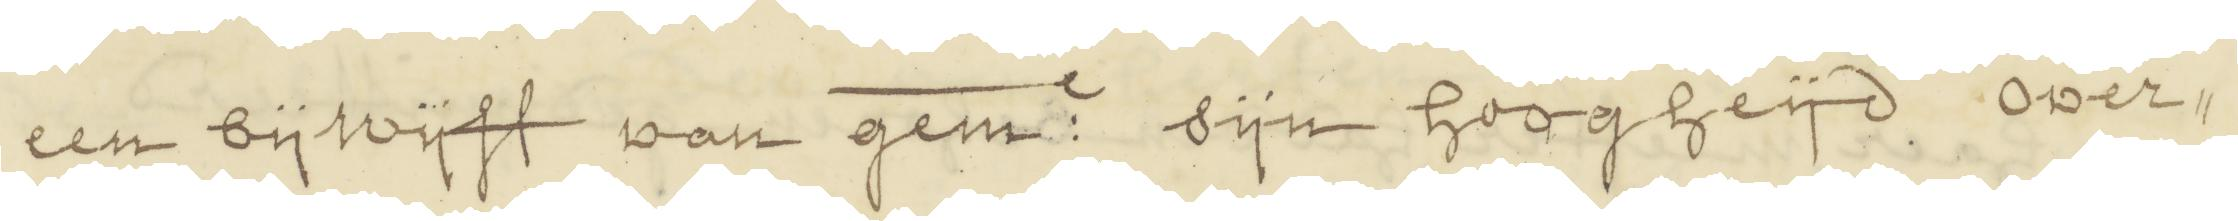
een bijwijff van gem:e sijn hoogheijd over„
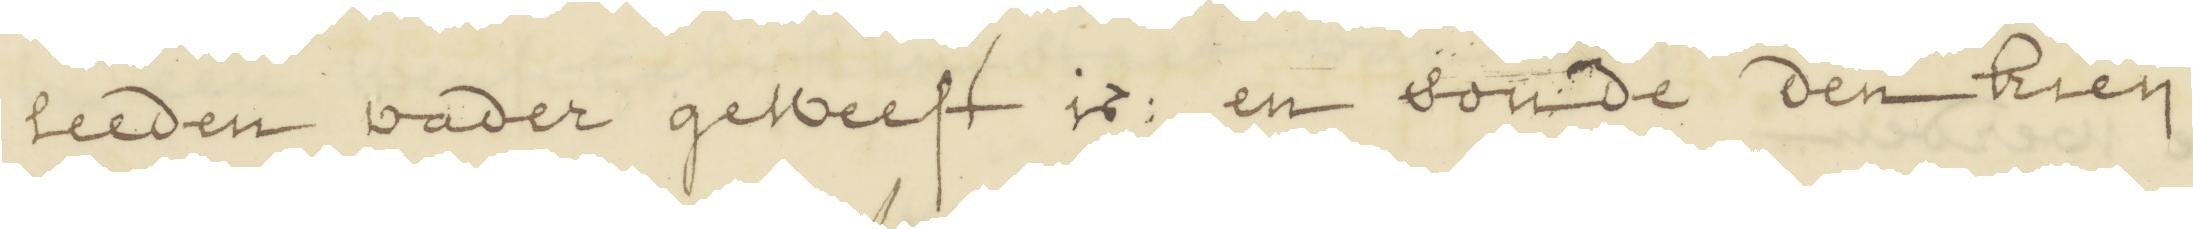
leeden vader geweest is: en soude den kieij
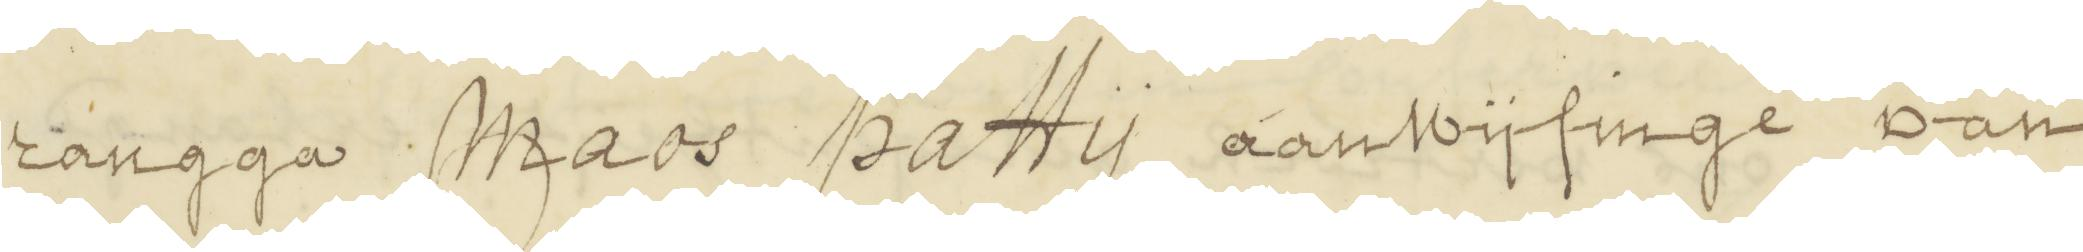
rangga Maos Pattij aanwijsinge van
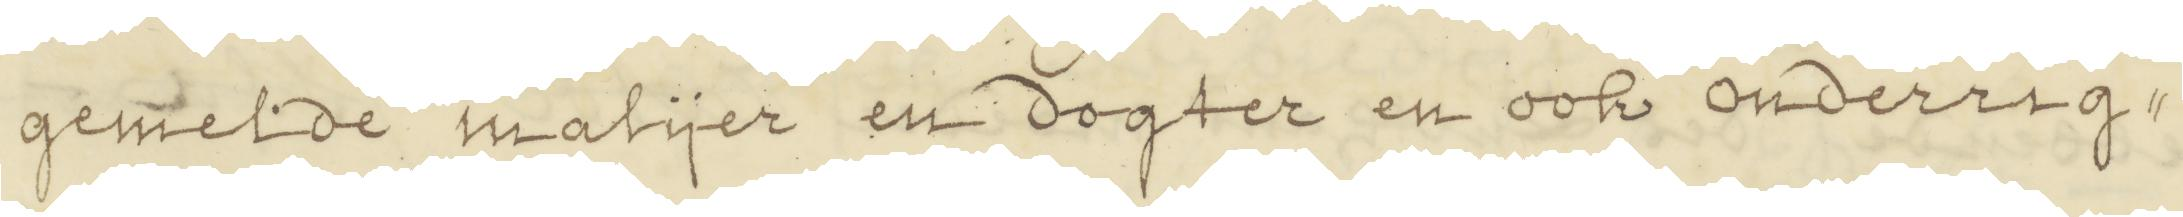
gemelde malijer en dogter en ook onderrig„
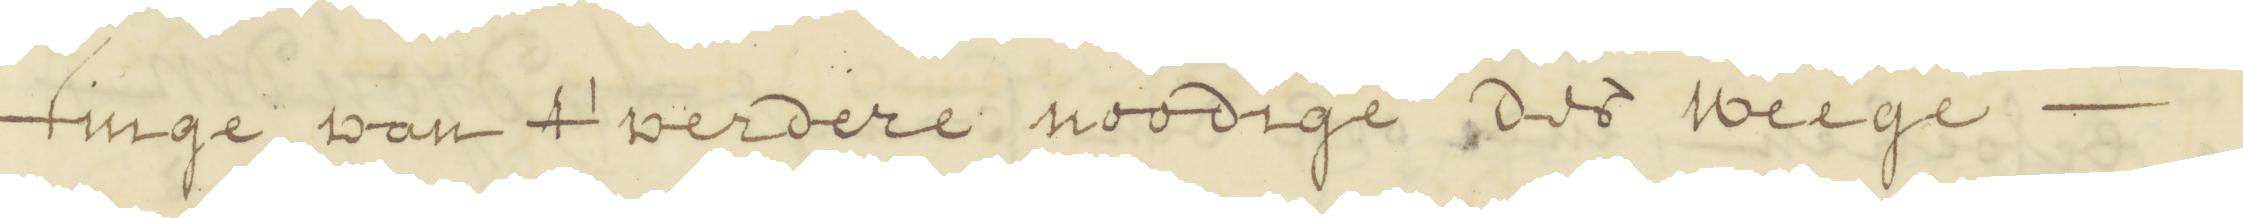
tinge van ’t verdere noodige des weege —
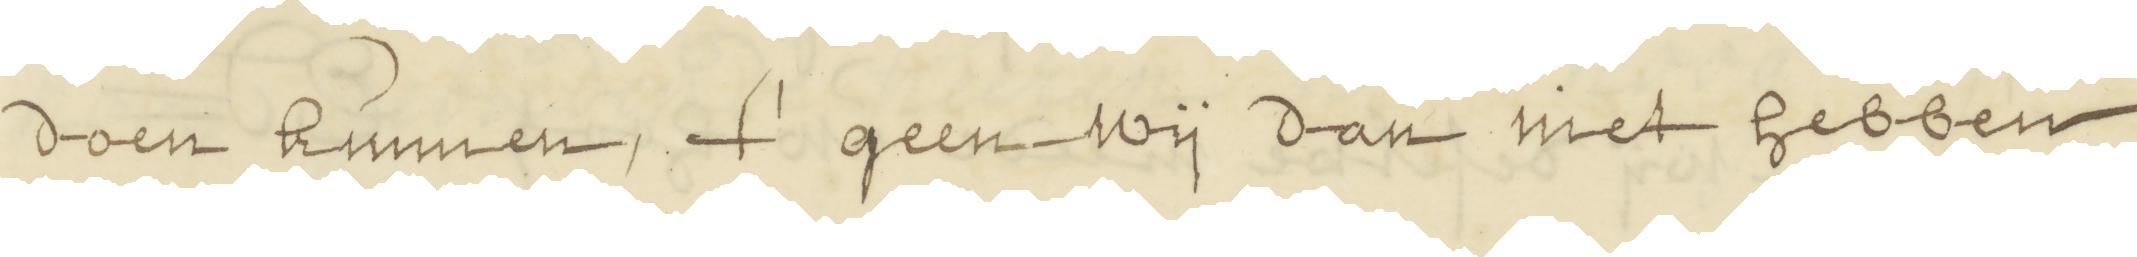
doen kunnen, t' geen wij dan niet hebben
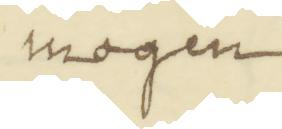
mogen
